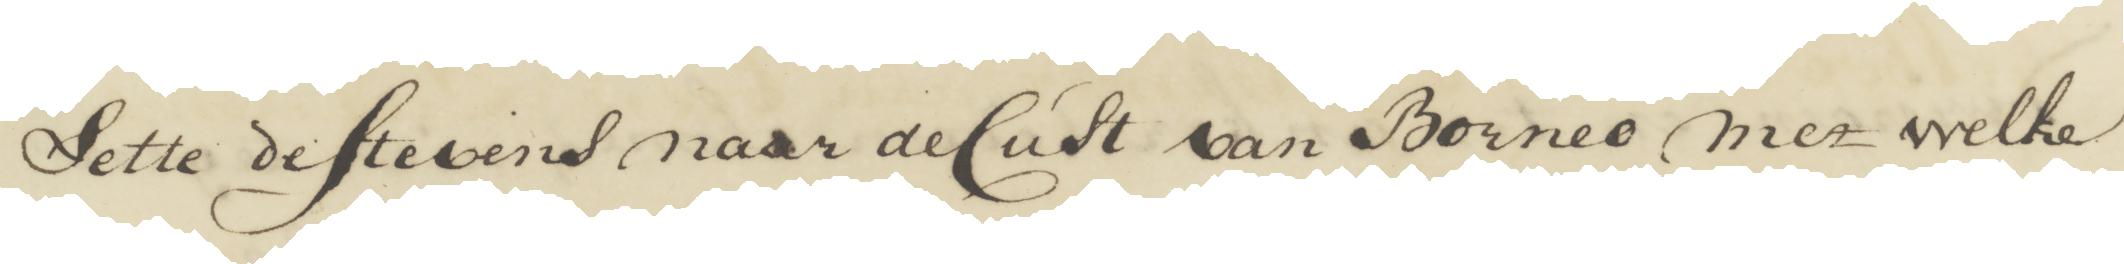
Sette de stevens naar de Cust van Borneo met welke
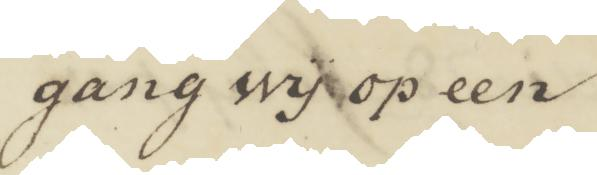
gang wij op een
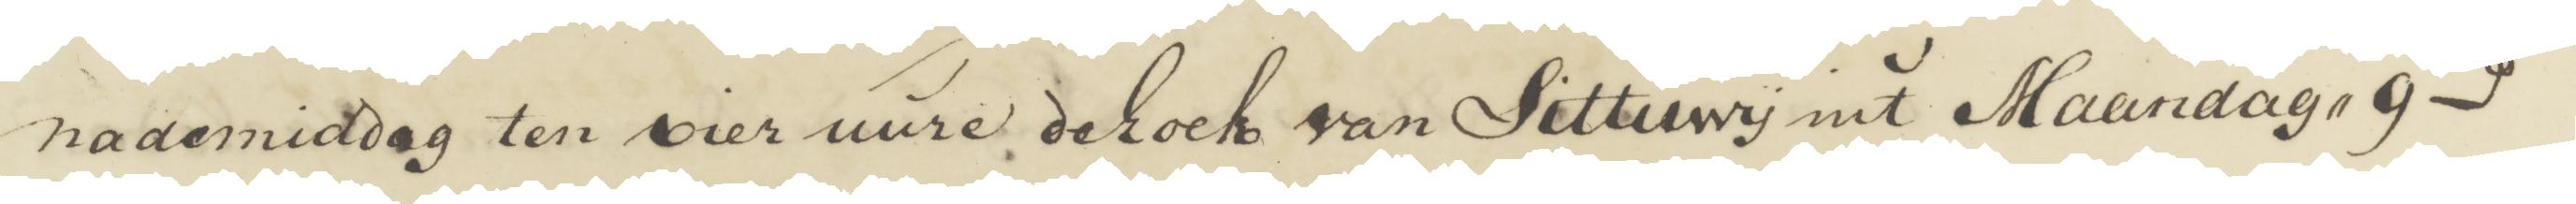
na demiddag ten vier uure dehoek van Sittuwij in’t Maandag „ 9 _o
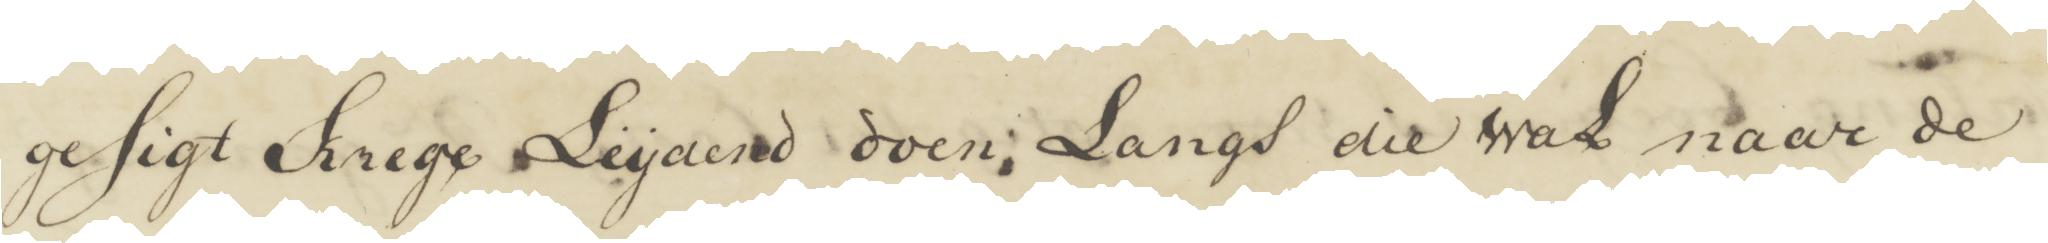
gesigt krege Leijdend doen Langs die wal naar de
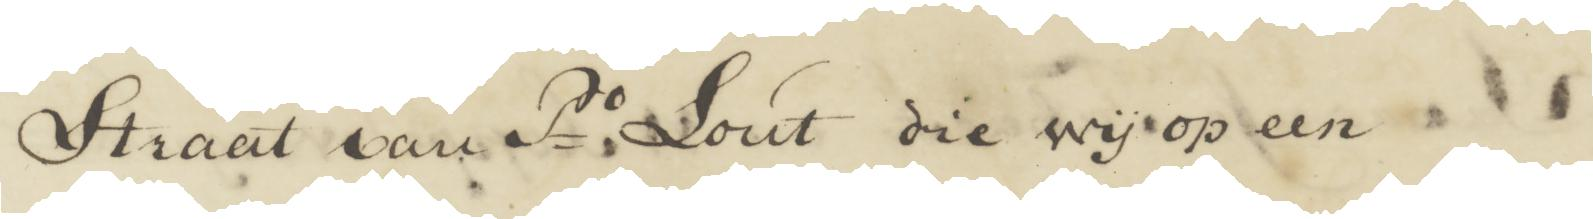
Straat van P=o Lout die wij op een
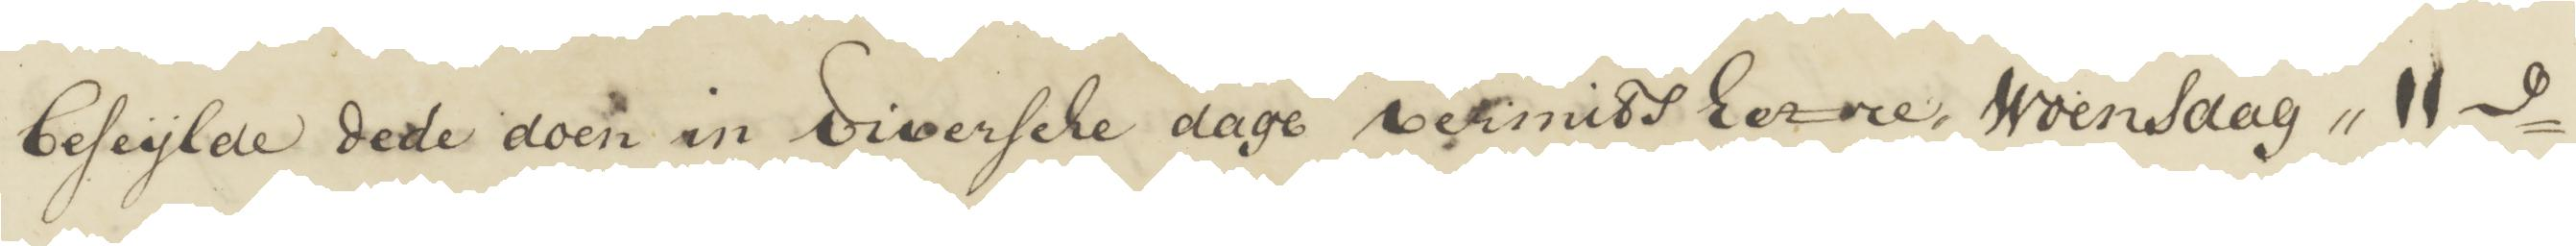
beseijlde dede doen in diversche dage vermits het re„ Woensdag „ 11 _=o
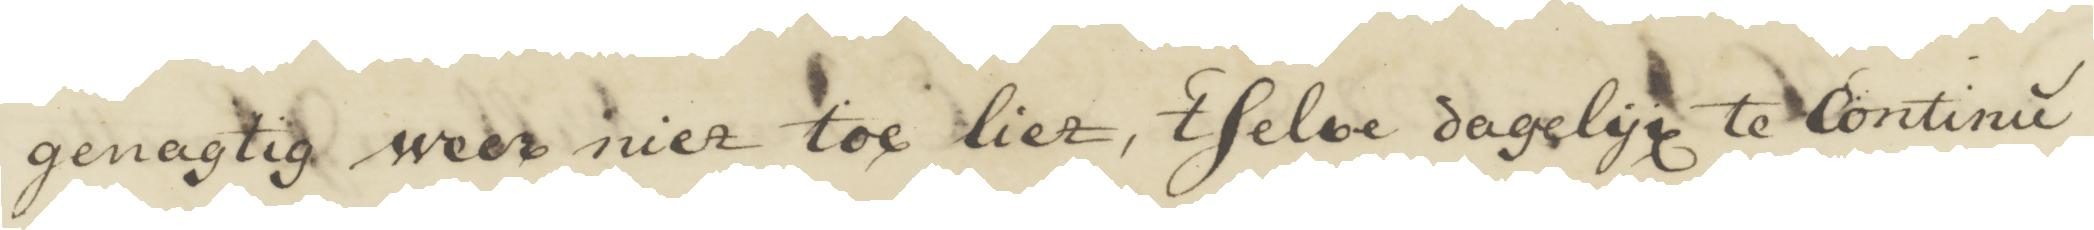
genagtig weer niet toe liet, 't selve dagelijx te continu
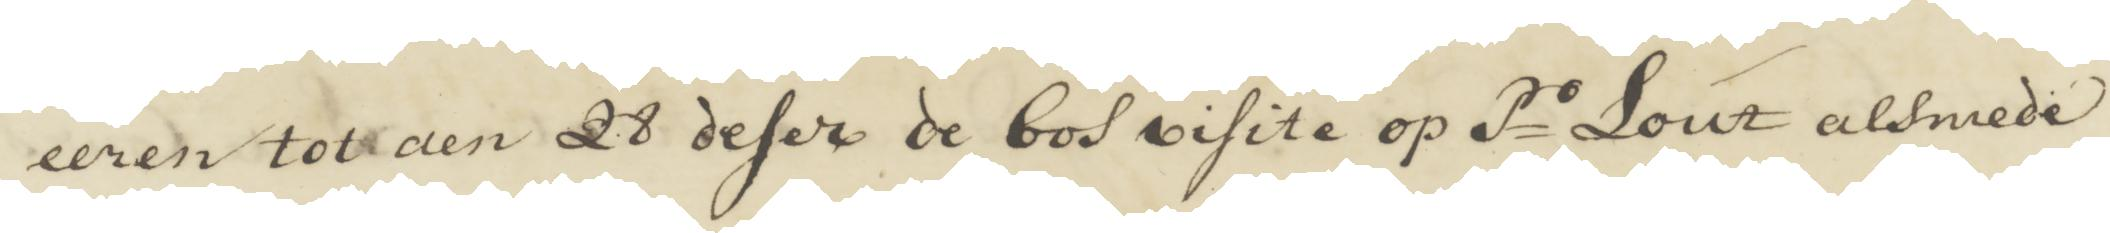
eeren tot den 28 deser de bos visite op P=o Lout alsmede
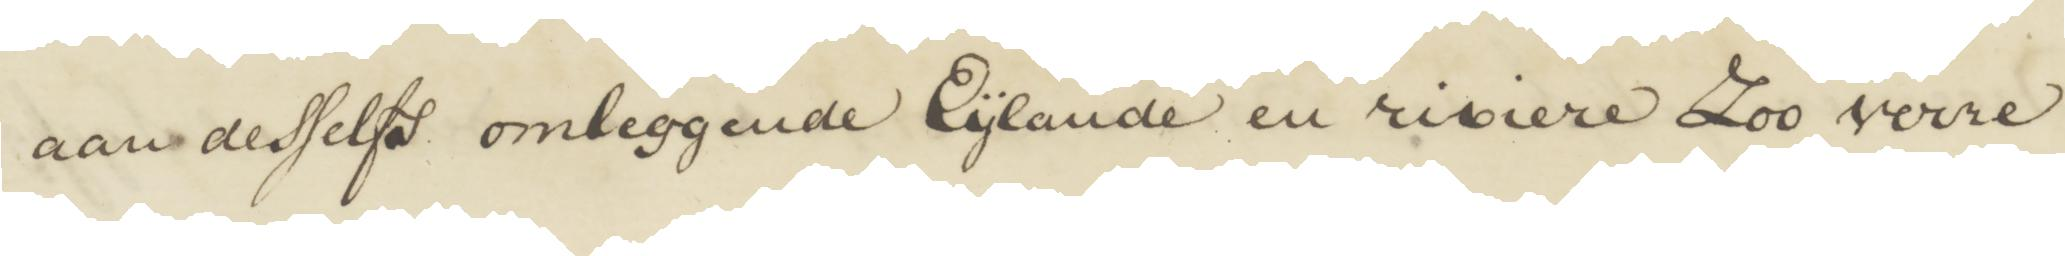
aan desselfs omleggende Eijlande en riviere zoo verre
